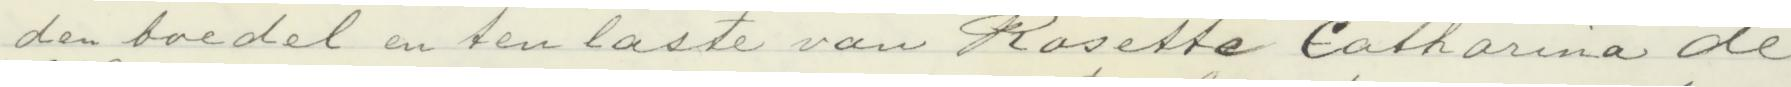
den boedel en ten laste van Rosette Catharina de
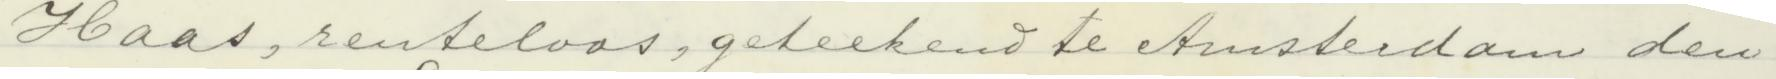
Haas, renteloos, geteekend te Amsterdam den
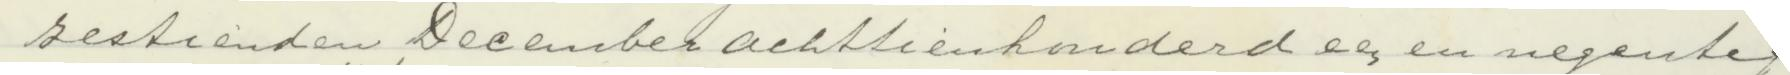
zestienden December achttienhonderd een en negentig
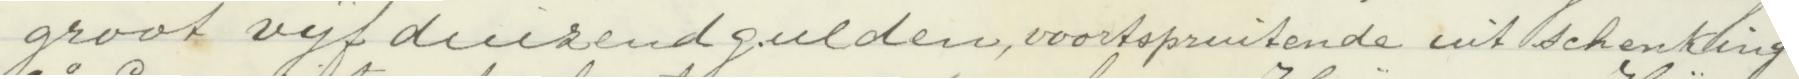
groot vyf duizend gulden, voortspruitende uit schenking
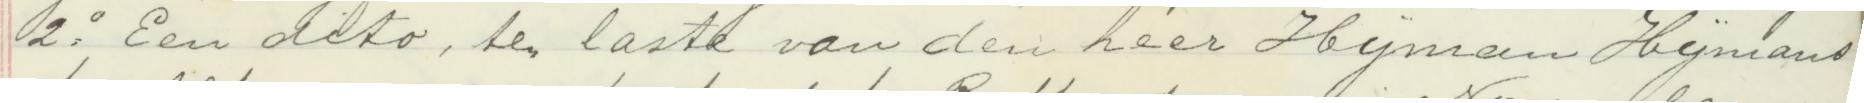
2:o Een dito, ten laste van den heer Hijman Hijmans
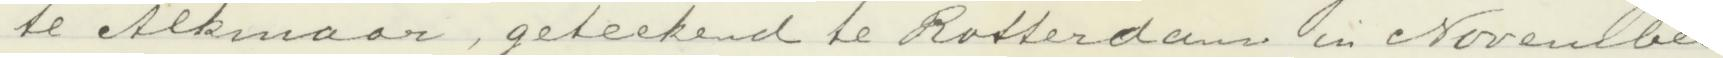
te Alkmaar, geteekend te Rotterdam in November
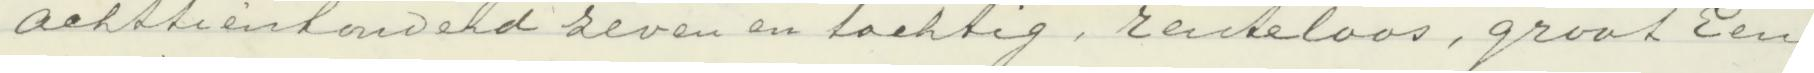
achttienhonderd zeven en tachtig, renteloos, groot Een
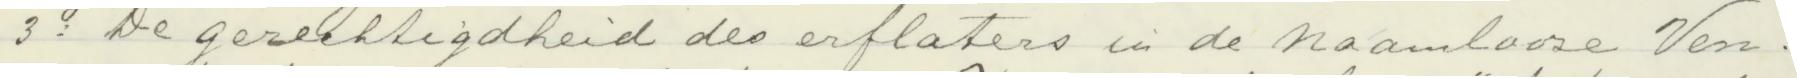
3:o De gerechtigdheid des erflaters in de naamlooze Ven
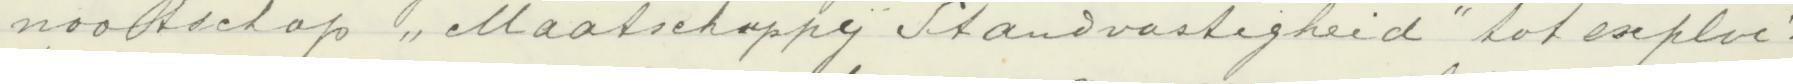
nootschap „ Maarschappij Standvastigheid " tot exploi
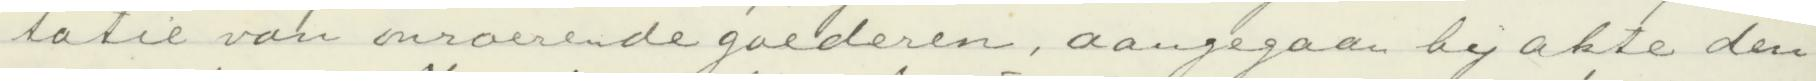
tatie van onroerende goederen, aangegaan bij akte den
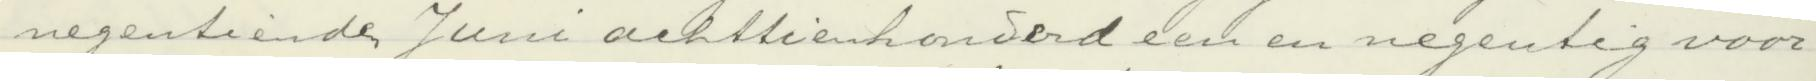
negentienden Juni achttienhonderd een en negentig voor
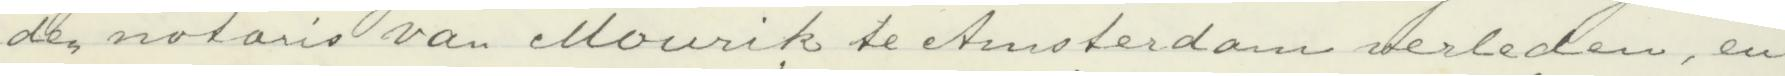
den notaris van Mourik te Amsterdam verleden, en
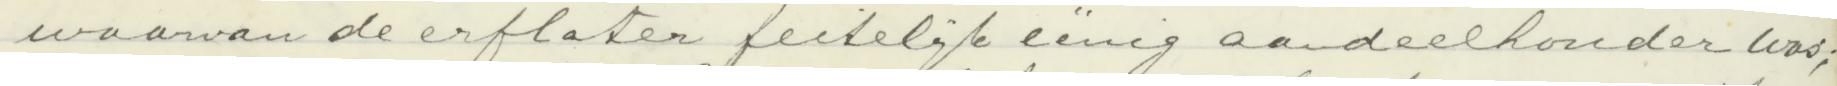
waarvan de erflater feitelijk eenig aandeelhouder was,
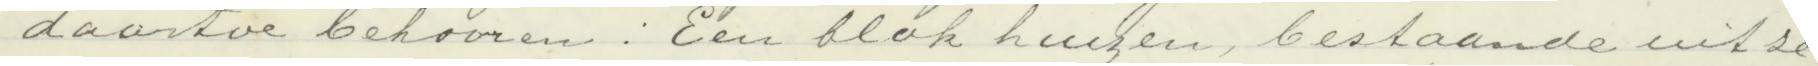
daartoe behooren: Een blok huizen, bestaande uit ze
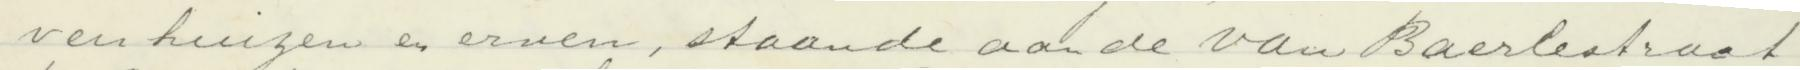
ven huizen en erven, staande aan de van Baerlestraat
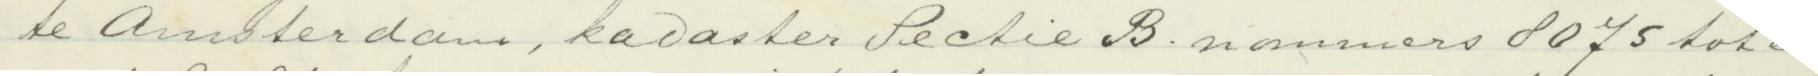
te Amsterdam, kadaster Sectie B. nommers 8075 tot en
